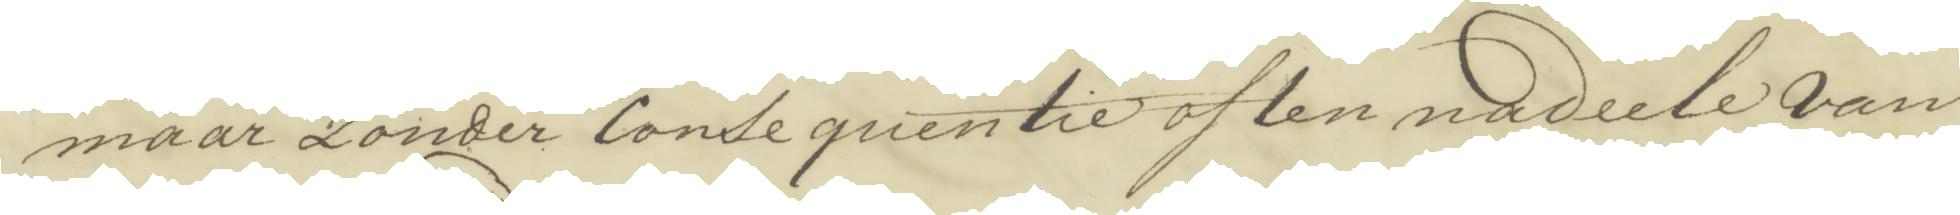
maar zonder Consequentie of ten nadeele van
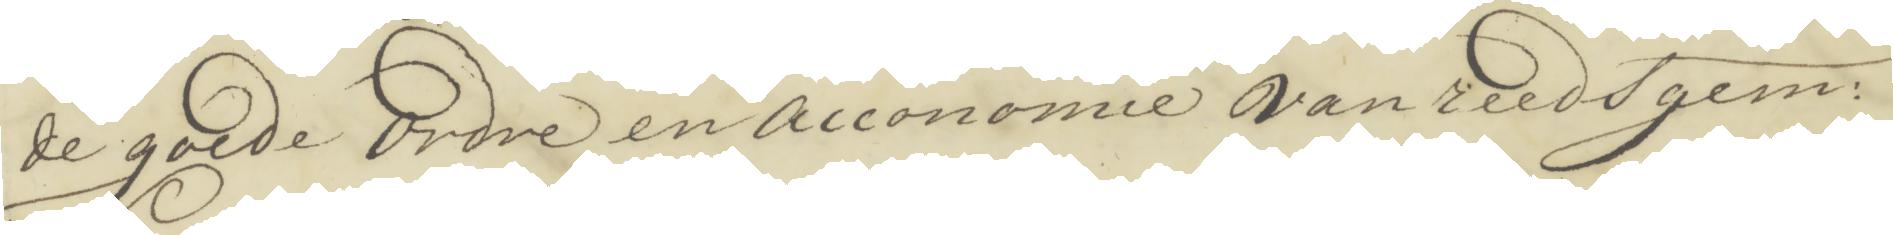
de goede ordre en acconomie van reeds gem:
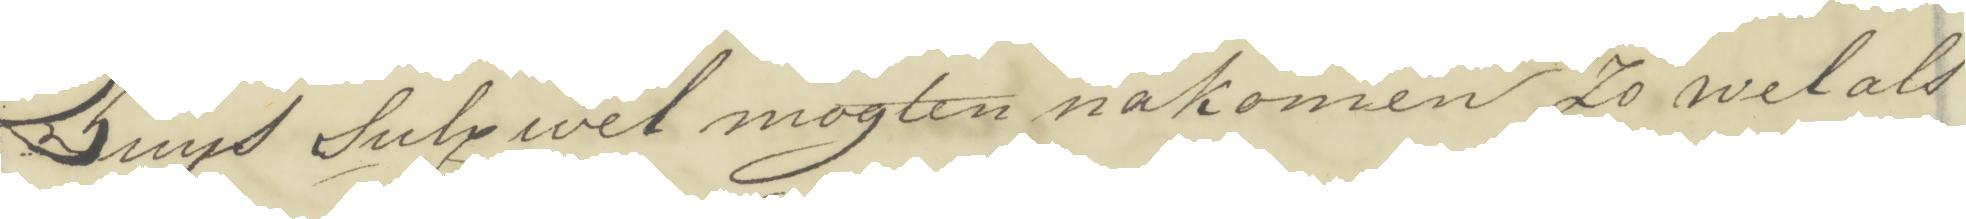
huys sulx wel mogten nakomen Zo wel als
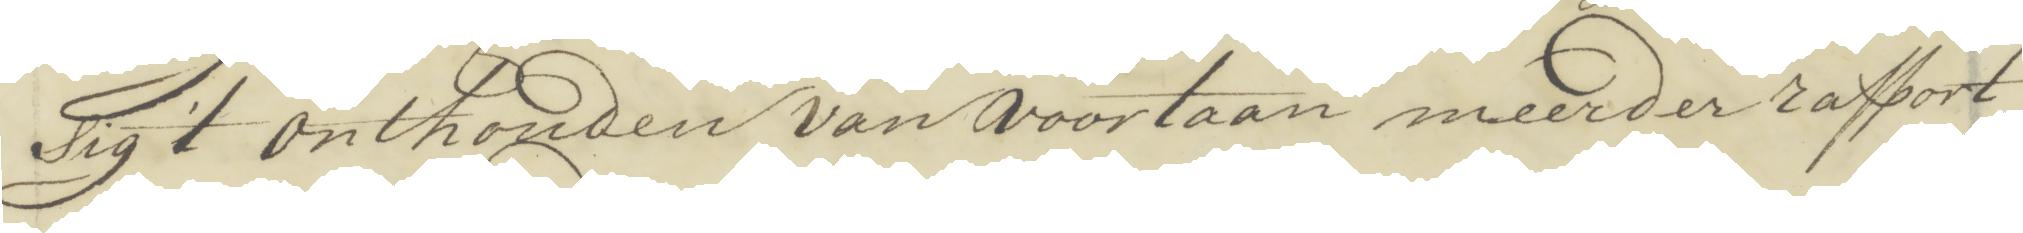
sig ’t onthouden van voortaan meerder rapport
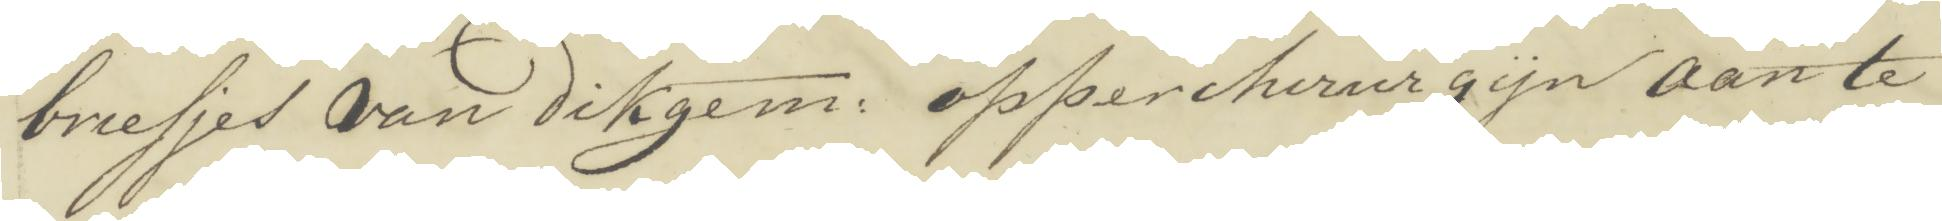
briefjes van dikgem: opperchirurgijn aan te
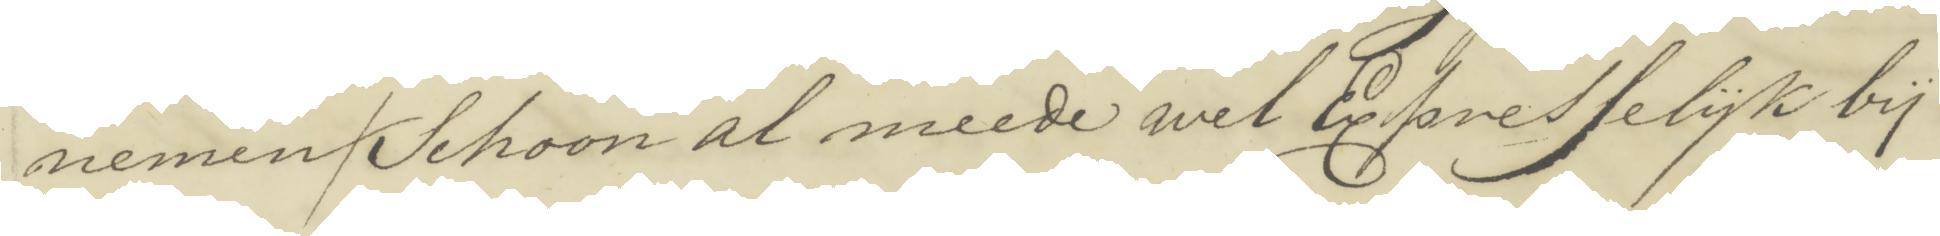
nemen /Schoon al meede wel Expresselijk bij
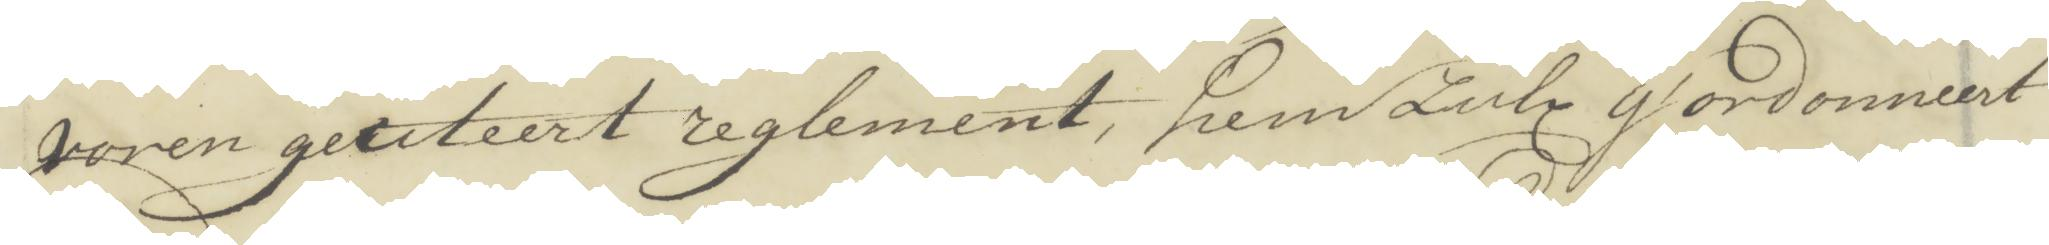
voren geciteert reglement, hem zulx g’ordonneert
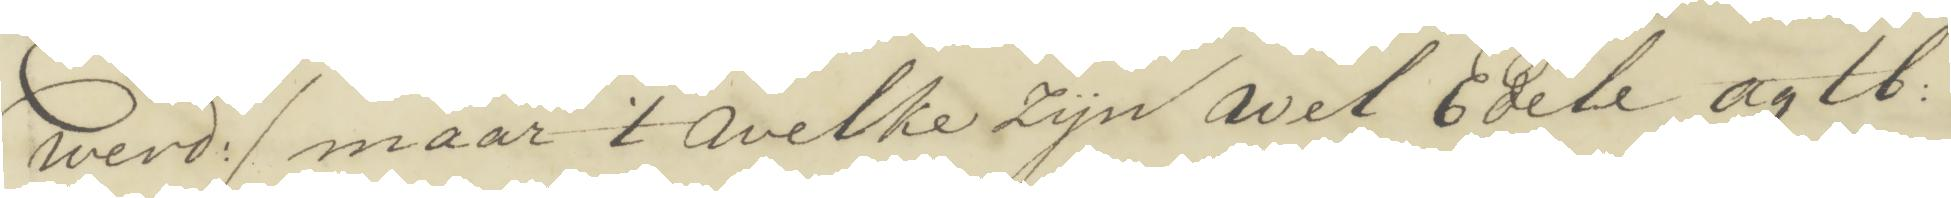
werd:/ maar ’t welke zijn wel Edele agtb:
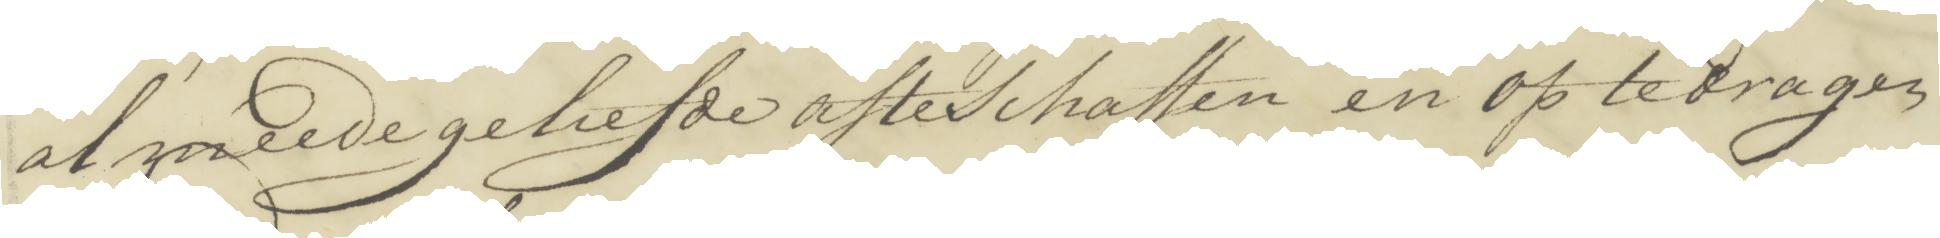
al meede geliefde afteschaffen en op te dragen
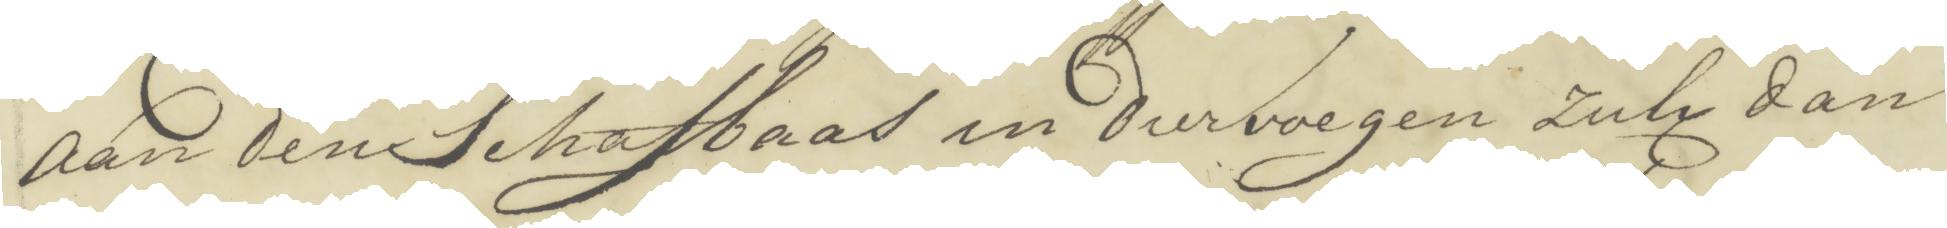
aan den Schafbaas in diervoegen zulx dan
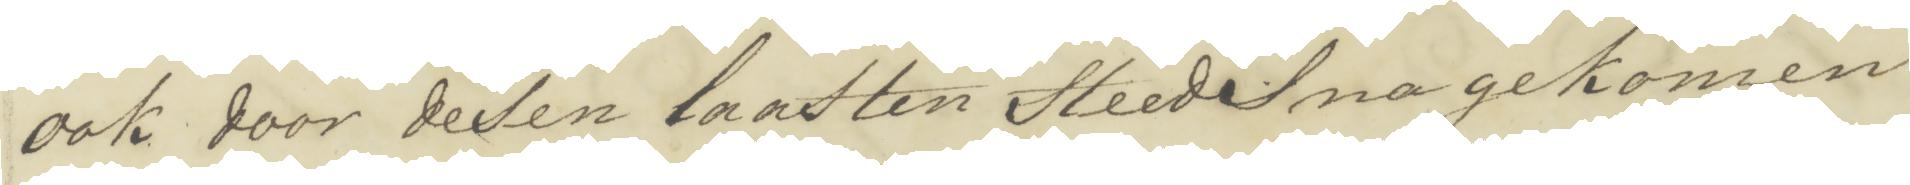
ook door desen laasten steeds na gekomen
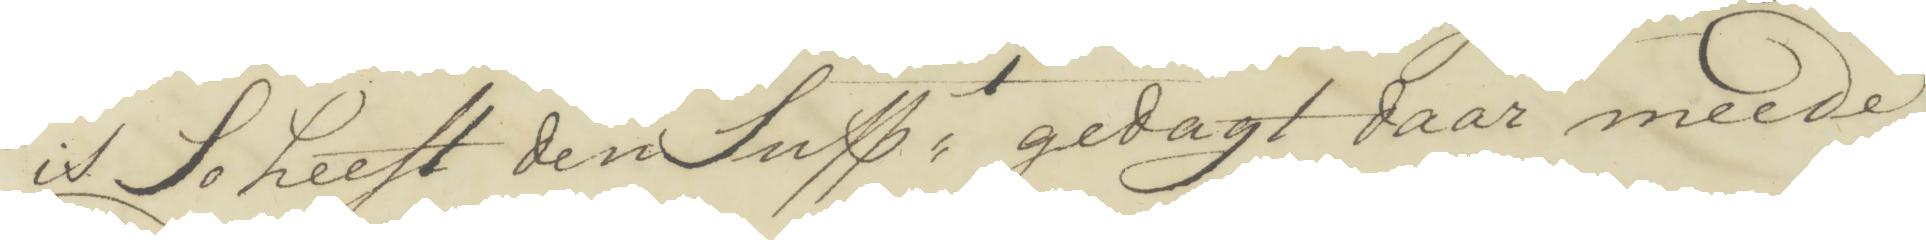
is So heeft den supp„t gedagt daar meede
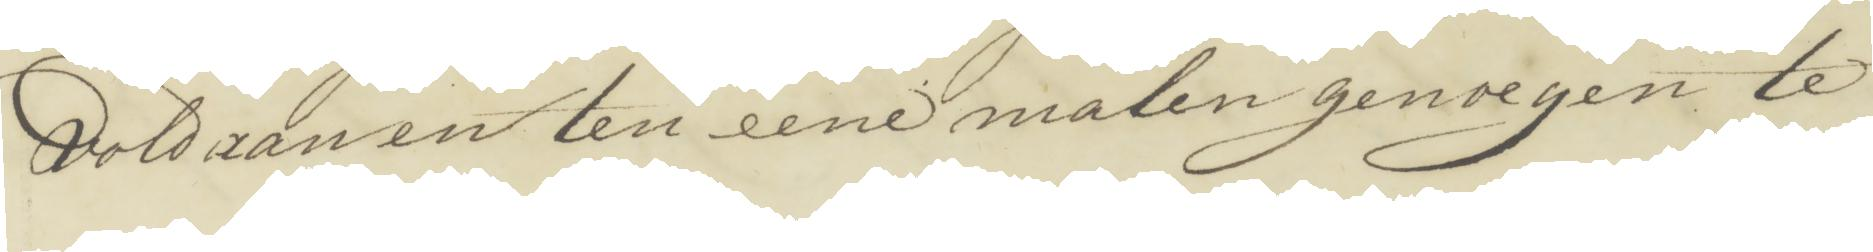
voldaan en ten eene malen genoegen te
